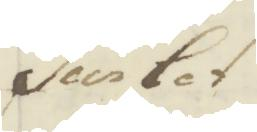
Sarles
